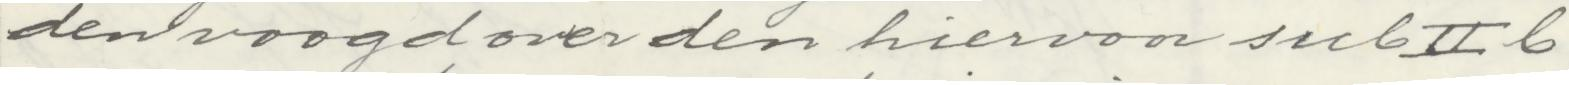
den voogd over den hiervoor sub II b
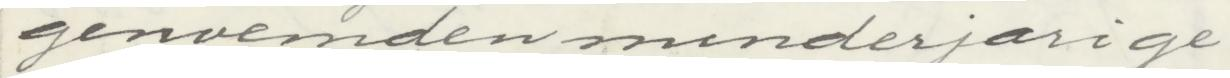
genoemden minderjarige
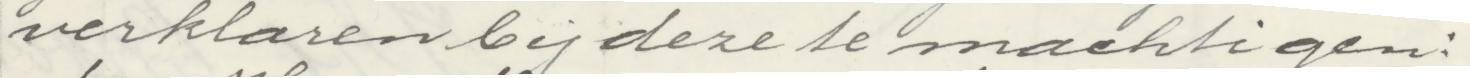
verklaren bij deze te machtigen:
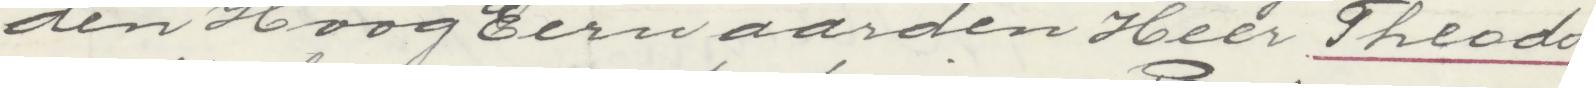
den Hoog Eerwaarden Heer Theodo
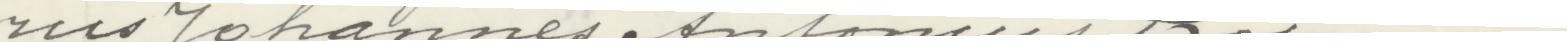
rus Johannes Antonius Bosman
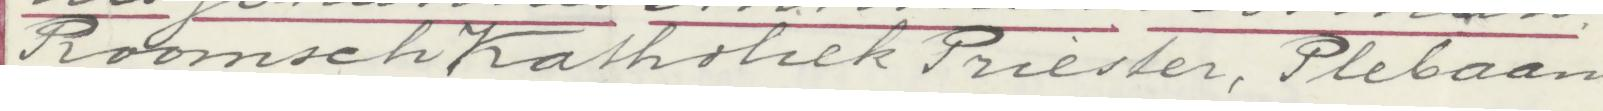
Roomsch Kathotiek Priester, Plebaan
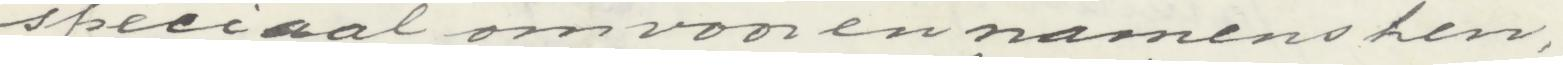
speciaal om voor en namens hen,
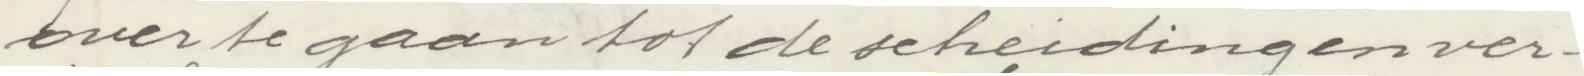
over te gaan tot de scheiding en ver-
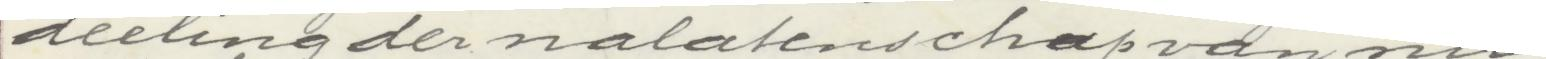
deeling der nalatenschap van nu
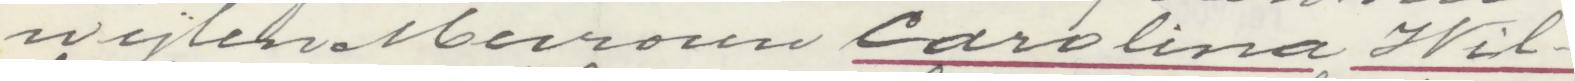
wijlen Mevrouw Carolina Wil-
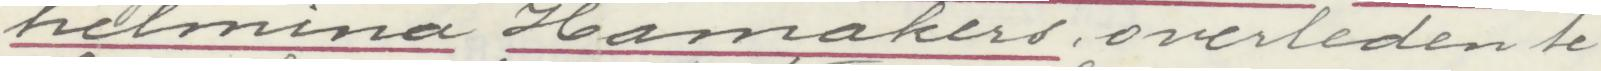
helmina Hamakers, overleden te
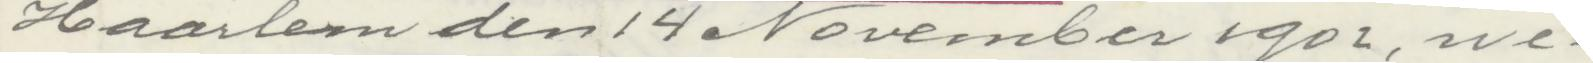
Haarlem den 14 November 1902, we-
